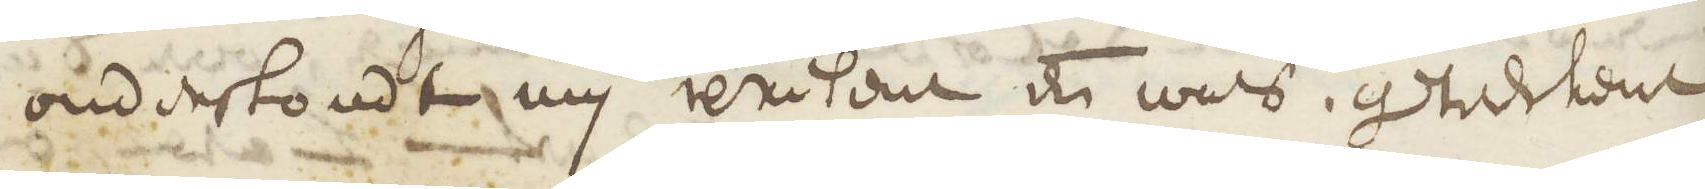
onderstondt mij present en was. geteekent
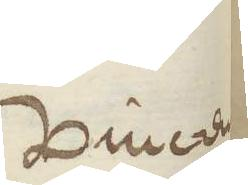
Vince
